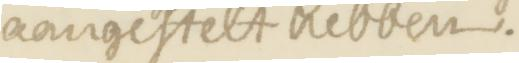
aangestelt hebben.
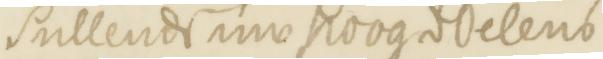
Sullende uw hoog Edelens
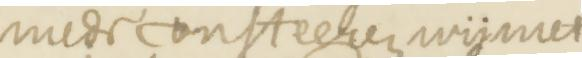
mede consteeren wij niet
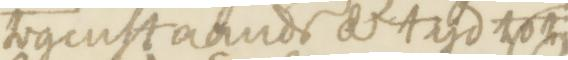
tegenstaands de tijd tot
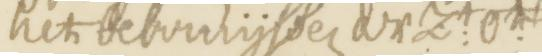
het bekruijssen der Z:t O:t
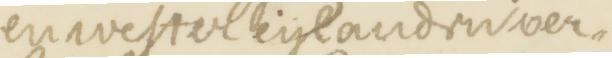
en wester eijlanden ver„
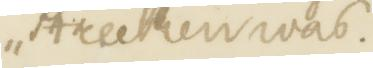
„streeken was.
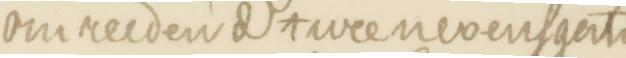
om reeden de twee nevens gem.
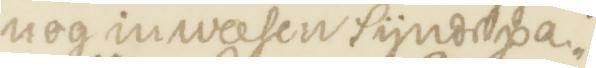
nog in weesen sijnde pa„
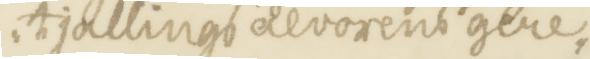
„tjallings alvorens gere„
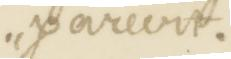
„pareert.
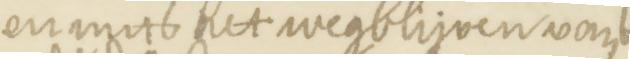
en mits het wegblijven van
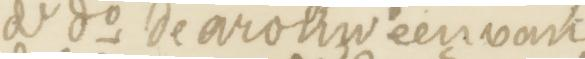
de d-o de arouw een van
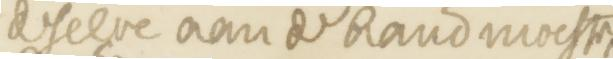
deselve aan de hand moeste
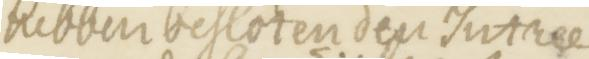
hebben besloten den Intree
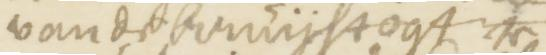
van de kruijstogt te
